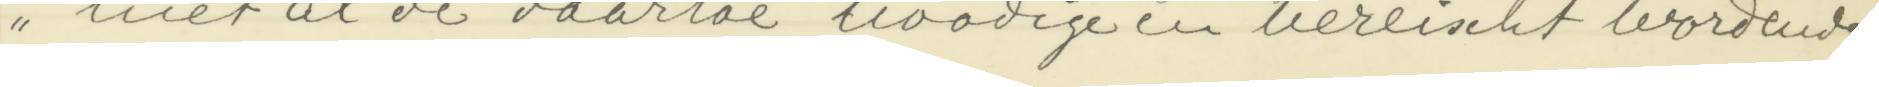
„ met al de daartoe noodige en vereischt wordende
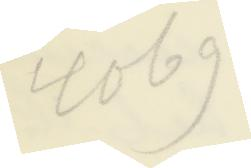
4069
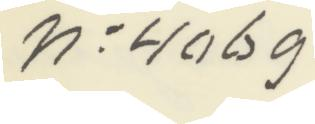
N.o 4069
